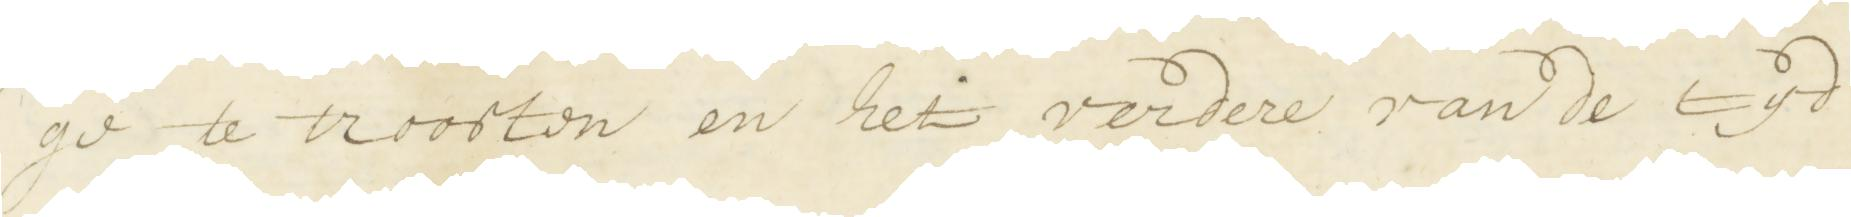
ge te troosten en het verdere van de tyd
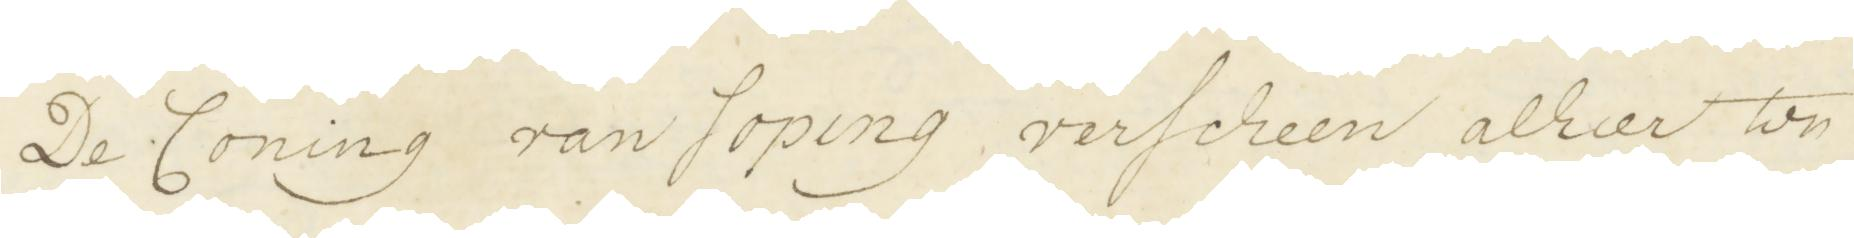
De Coning van soping verscheen alhier ten
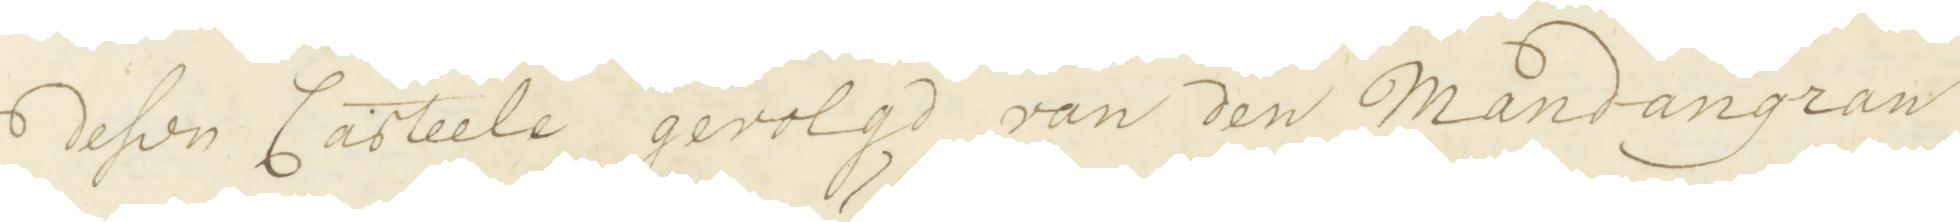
desen Casteele gevolgd van den Mandangran
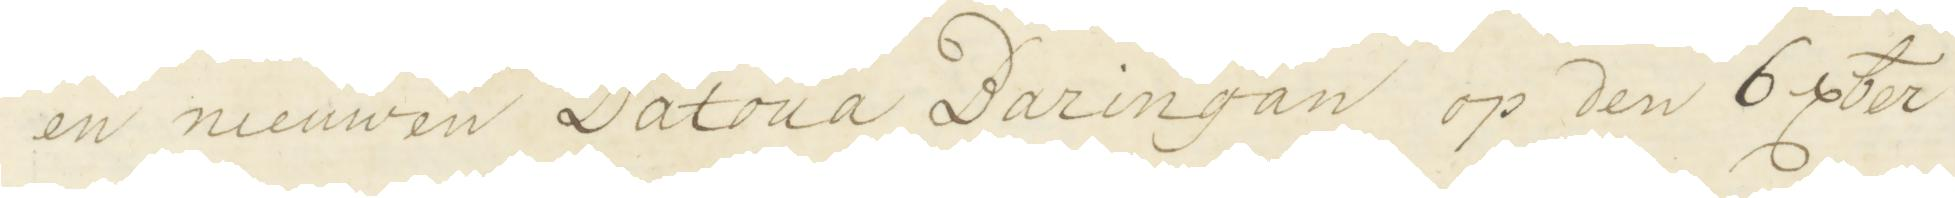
en nieuwen Datoua Baringan op den 6 xber
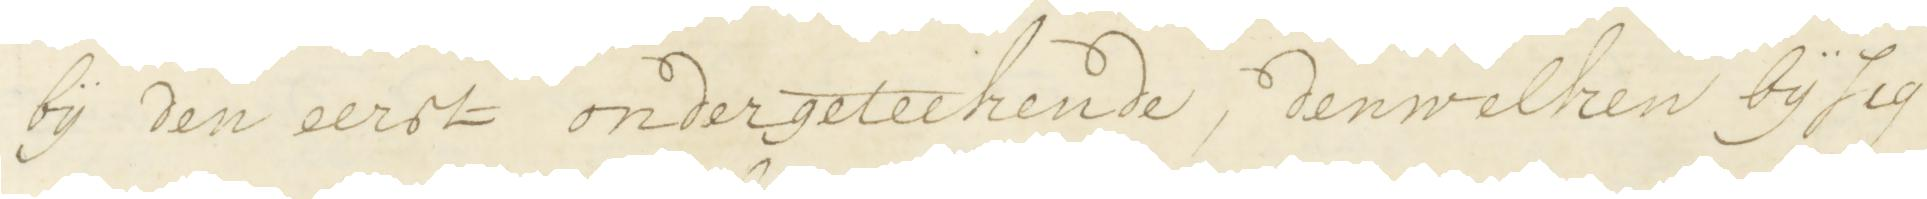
bij den eerst ondergeteekende, denwelken bij sig
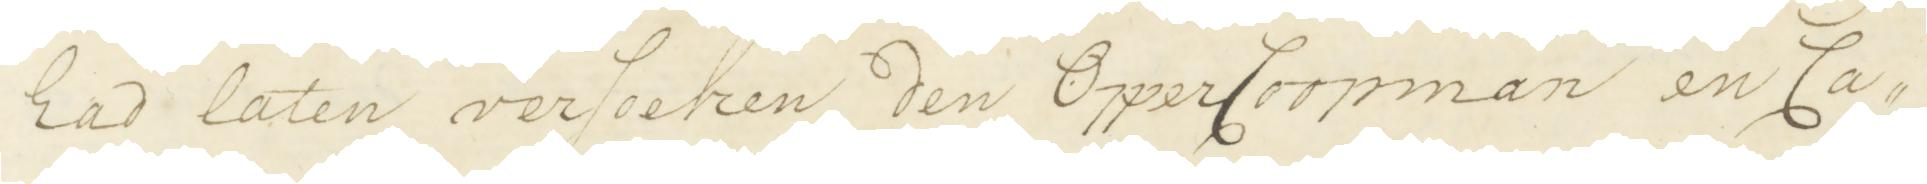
had laten versoeken den Oppercoopman en Ca„
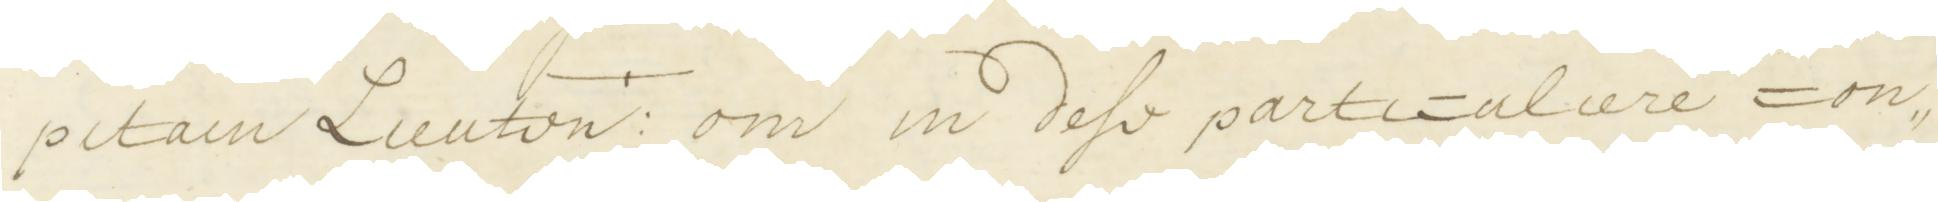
pitain Lieuten:t om in dese particaliere con„
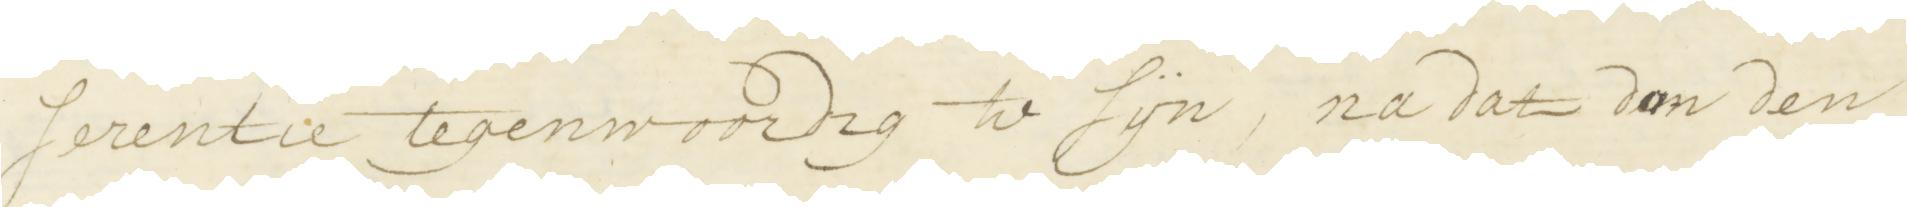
ferentie tegenwoordig te sijn, na dat dan den
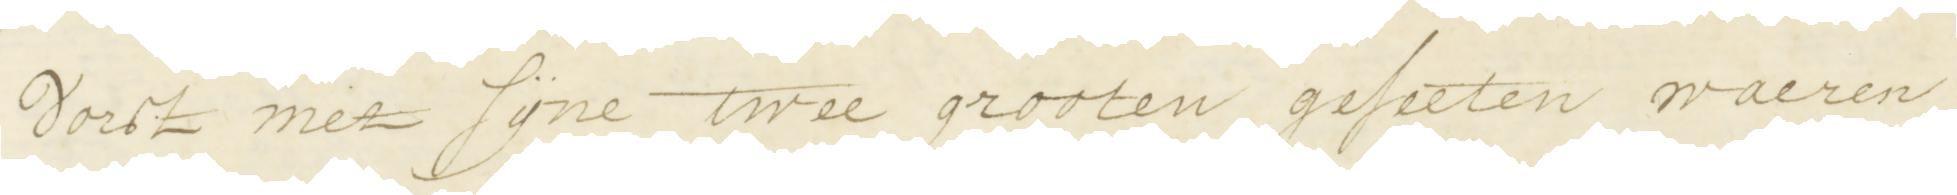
vorst met sijne twee grooten geseeten waeren
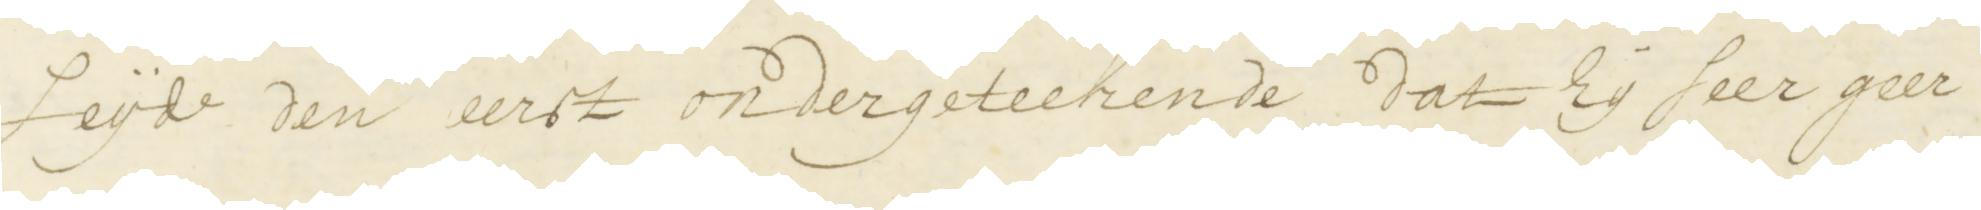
seijde den eerst ondergeteekende dat hij seer geer
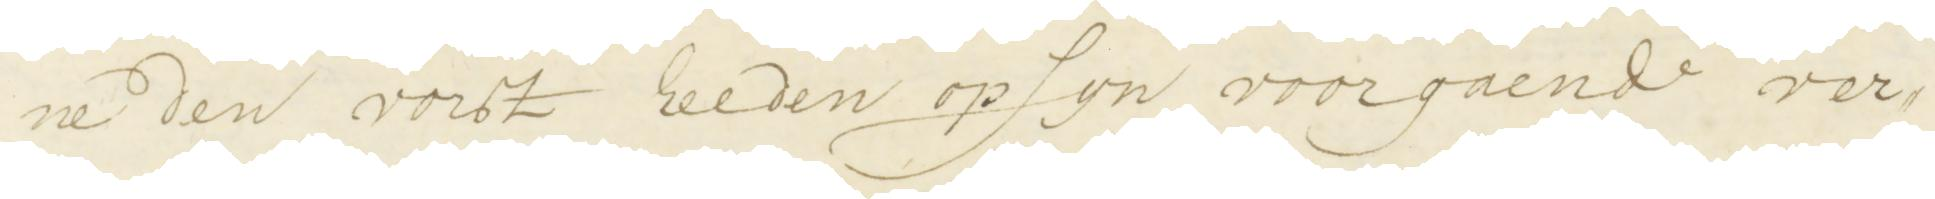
ne den vorst heeden op syn voorgaende ver„
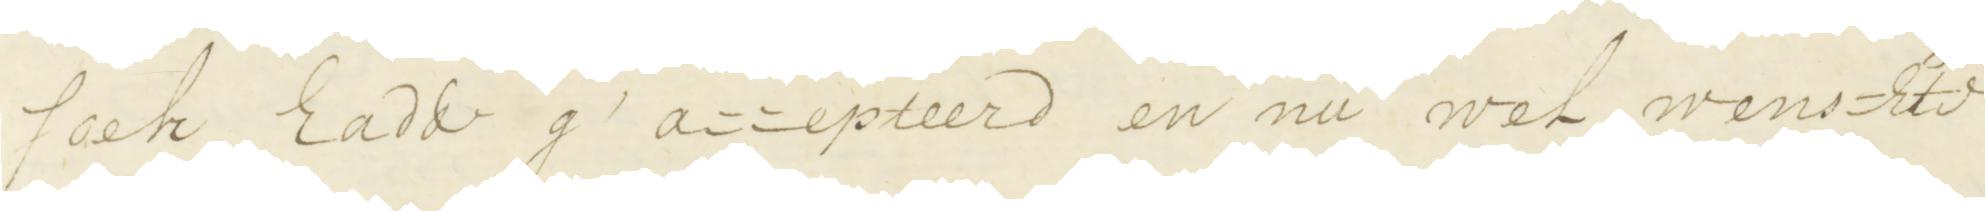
soek hadde g’ accepteerd en nu wel wenschte
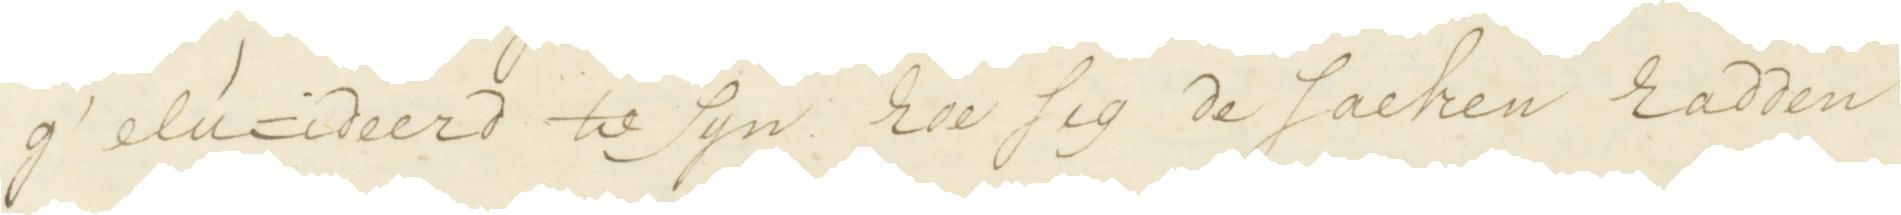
g’ elucideerd te syn hoe sig de saeken hadden
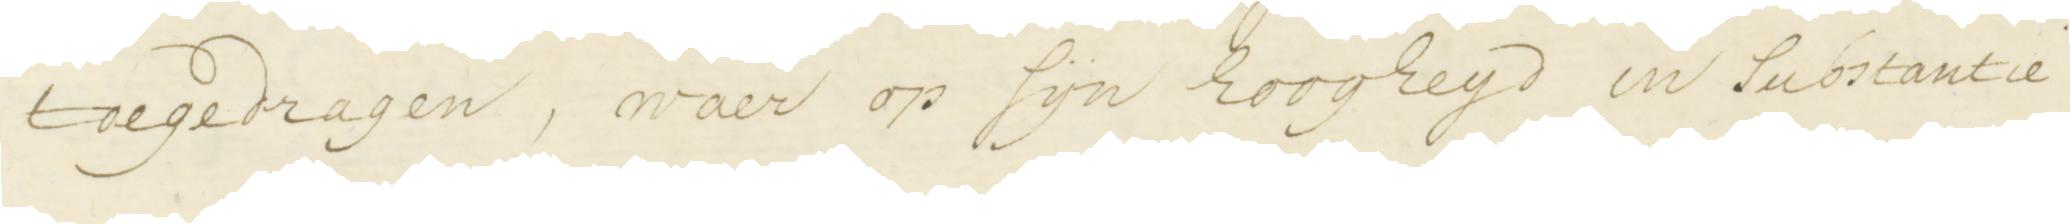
toegedragen, waer op sijn hoogheyd in substantie
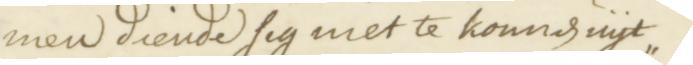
men diende sig niet te konnen uijt„
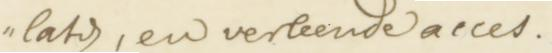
„laten, en verleende acces.
